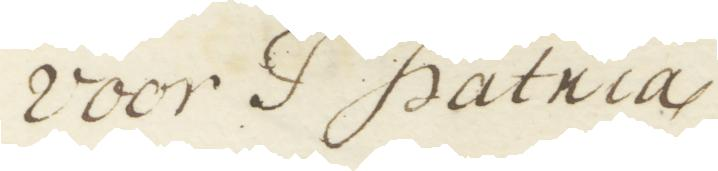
voor 'T patria
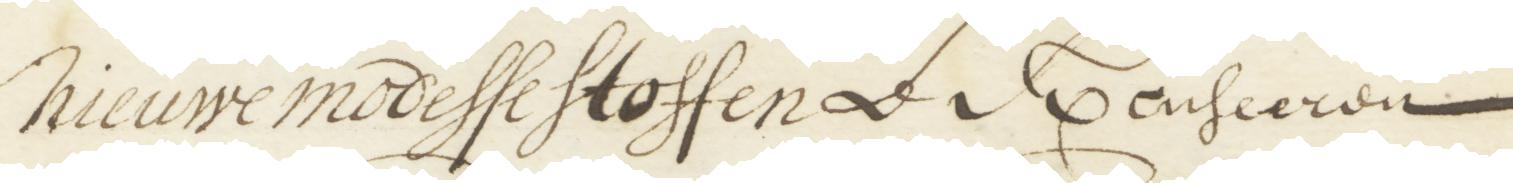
nieuwe modesse stoffen te Excuseeren
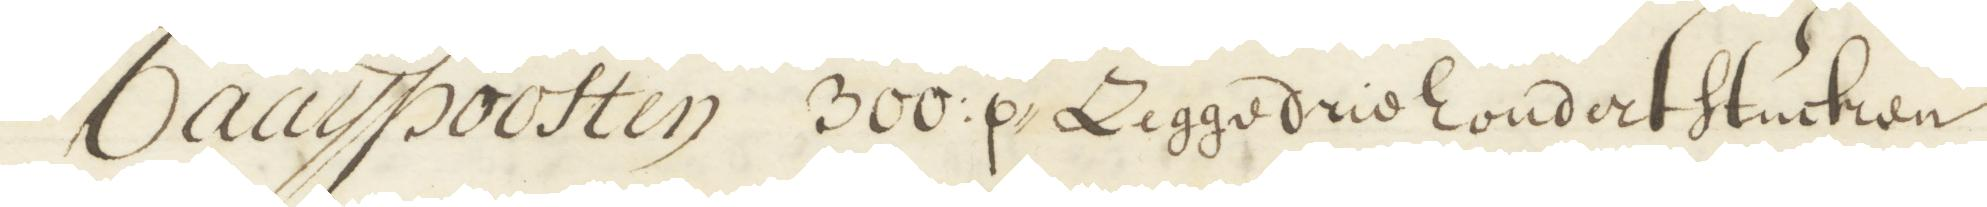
Baaijpoosten 300: p„s zegge drie hondert stucken
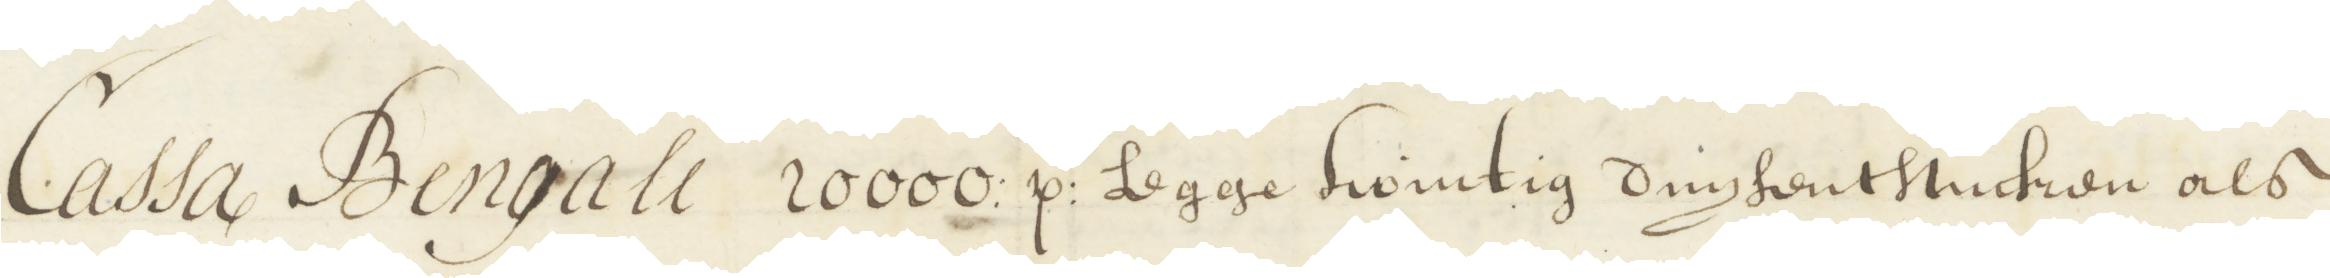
Cassa Bengale 20000: p:s segge twintig duysent stucken als
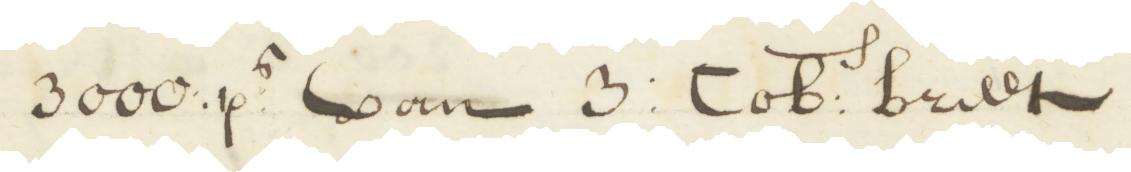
3000: p:s van 3: Cob:s breet
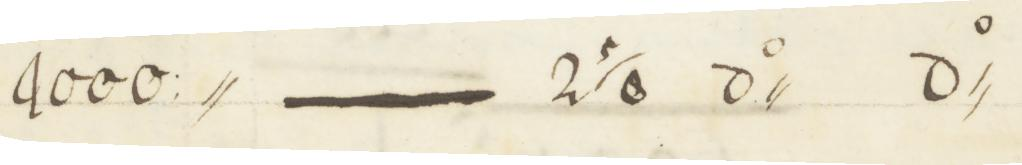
4000: „ _ 2 5/8 d„o d„o
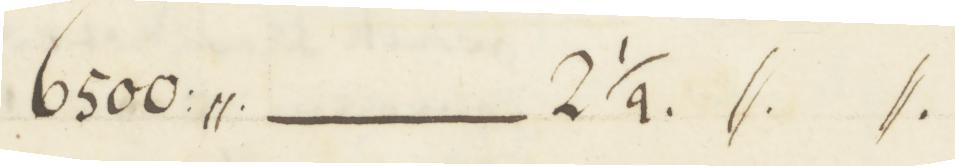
6500: „. _ 2¼. „. „.
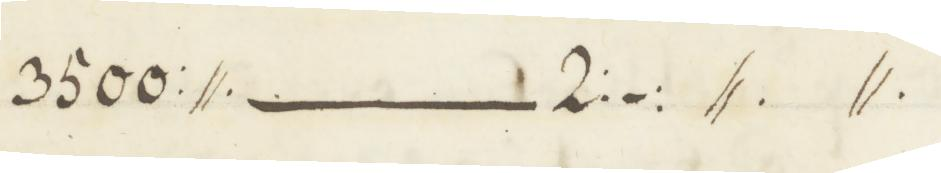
3500:„. _ 2:-: „. „.
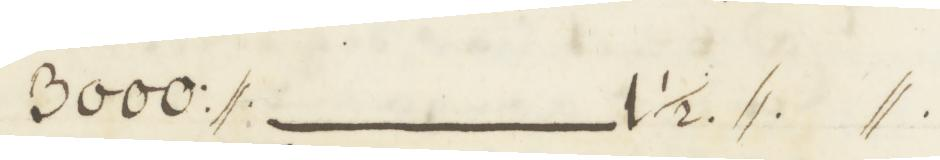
3000:„: _ 1½: „. „.
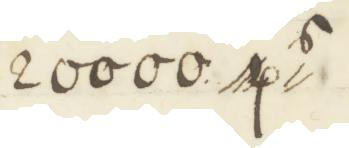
20000: „p„s
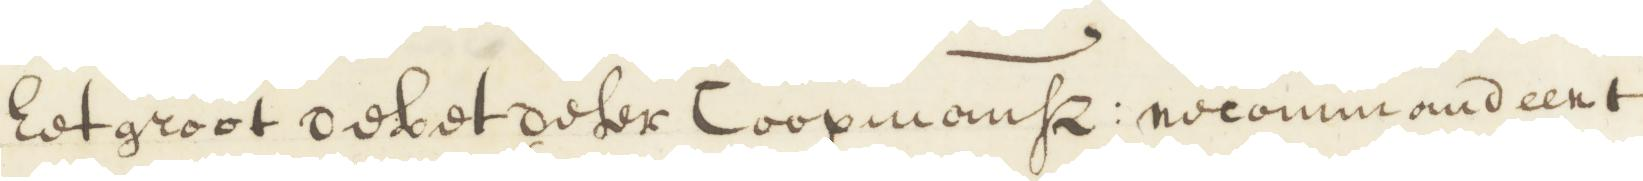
het groot debet deser Coopmansz: recommandeert
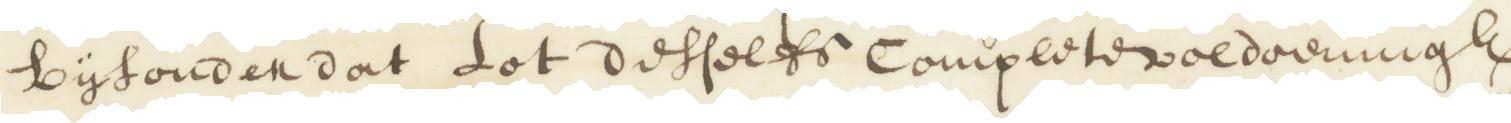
bijsonder dat tot desselfs Complete voldoeningh
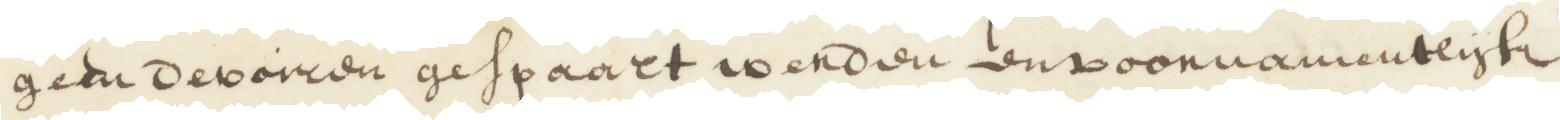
geen devoiren gespaart werden en voornamentlijk
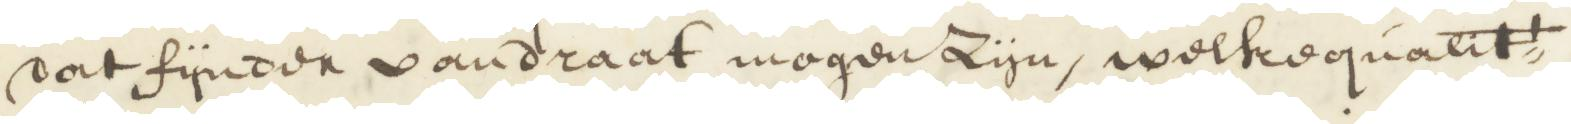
dat fijnder van draat mogen zijn, welke qualit„t
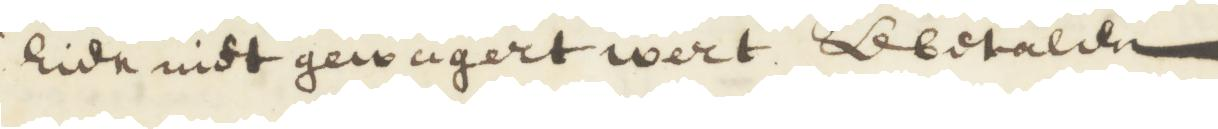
hier niet geweigert wert te betalen
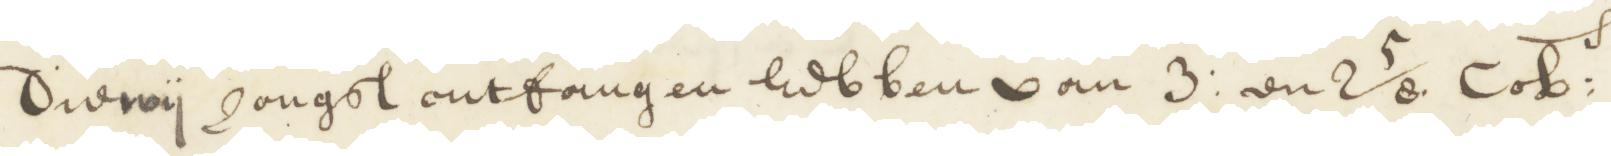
die wij jongst ontfangen hebben van 3: en 2 5/8. Cob:s
